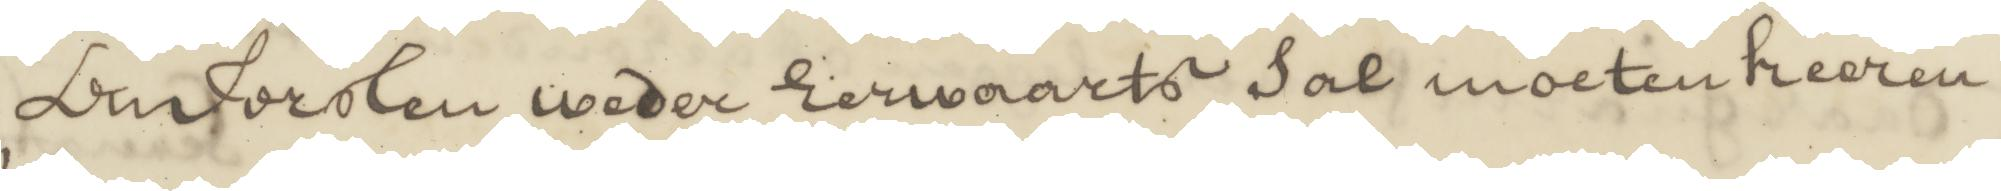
ten Eersten weder herwaarts sal moeten keeren
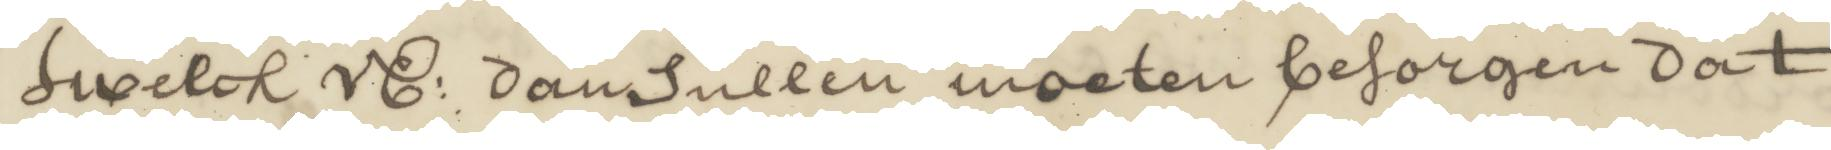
'twelck UE: dan sullen moeten besorgen dat
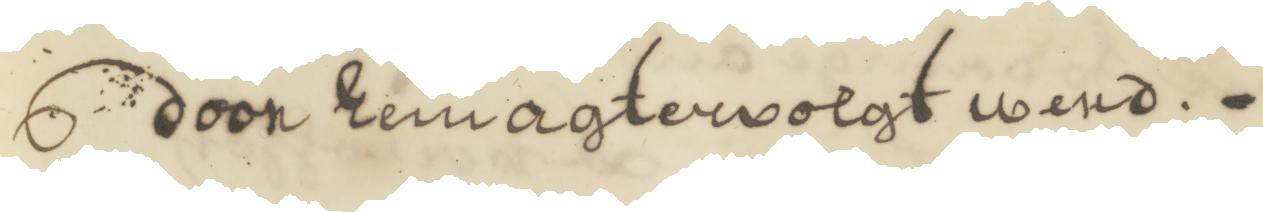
door hem agtervolgt werd.
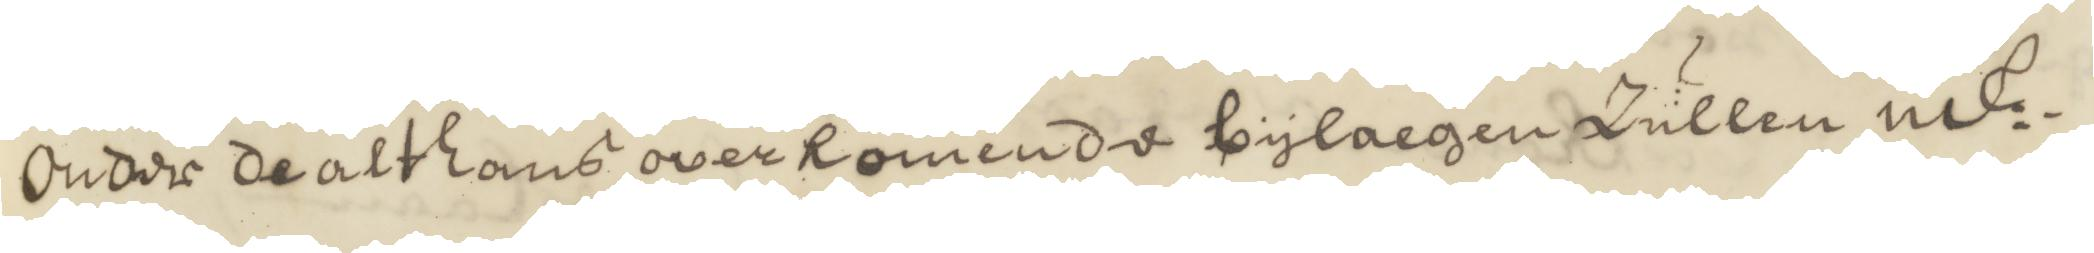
Onder de althans overkomende bijlaegen zullen uE:-
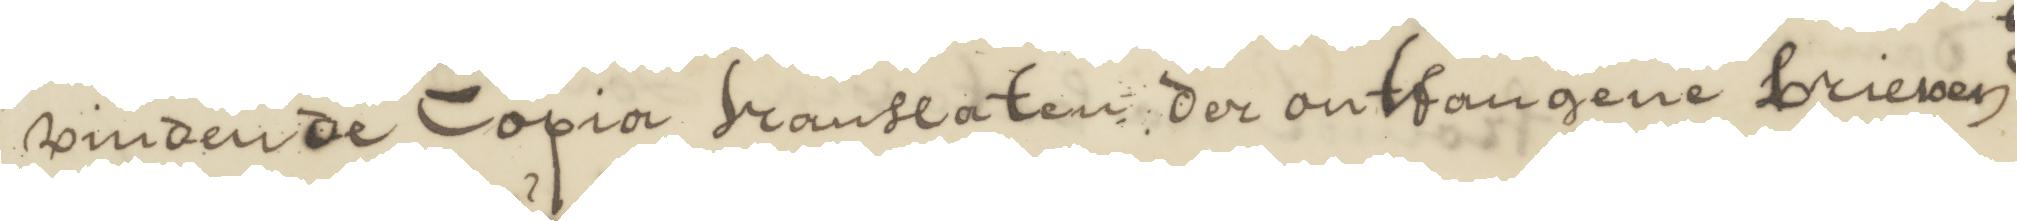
vindende Copia translaten der ontfangene brieven
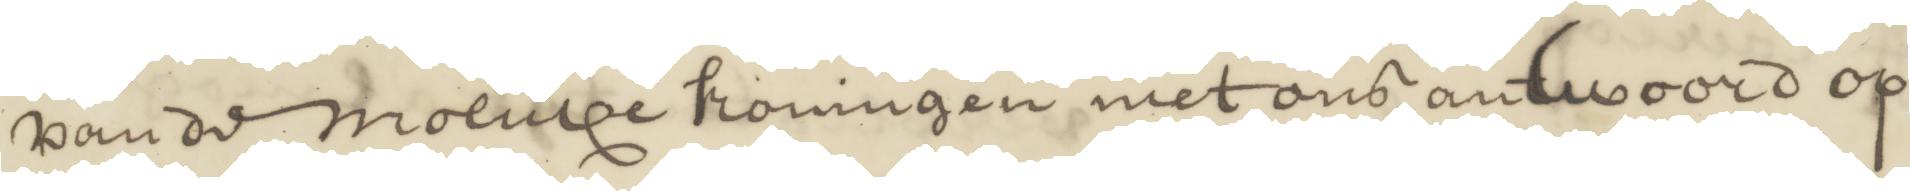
van de moluxe koningen met ons antwoord op
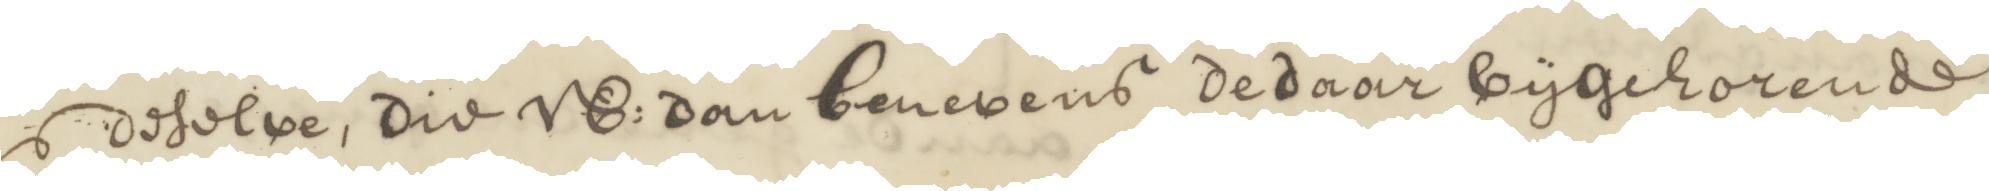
deselve, die UE: dan benevens de daar bijgehorende
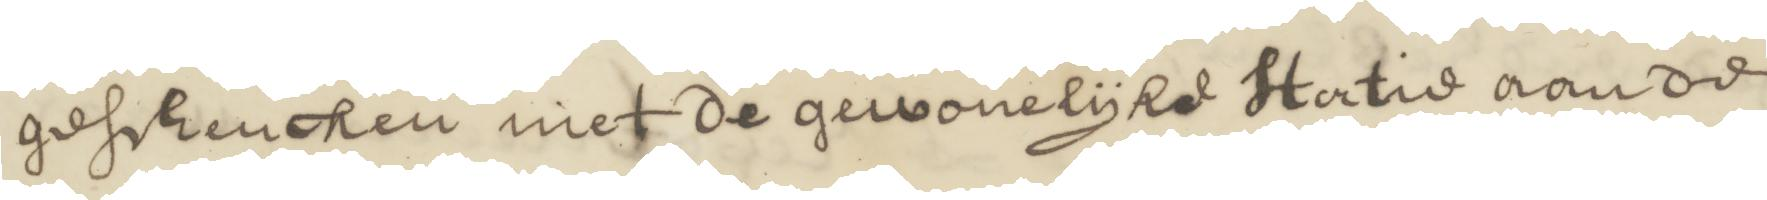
geschencken met de gewonelijke statie aan de
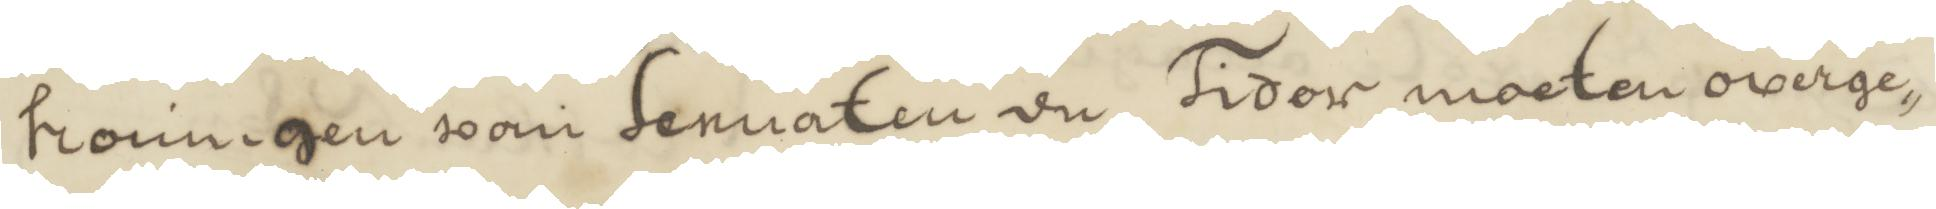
konigen van ternaten en Tidor moeten overge„
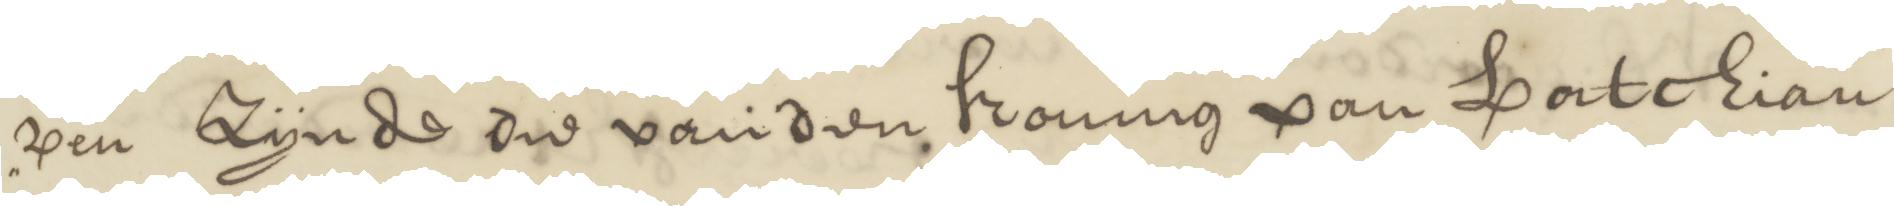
„ven zijnde die van den koning van batchian
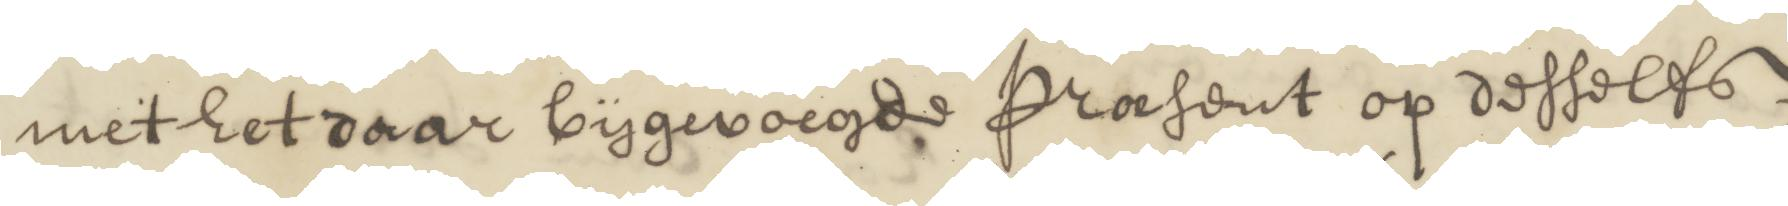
met het daar bijgevoegde praesent op desselfs
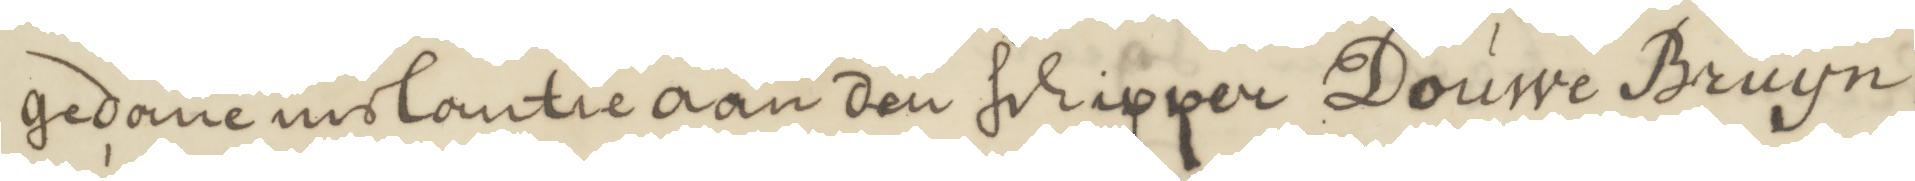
gedane instantie aan den schipper Douwe Bruijn
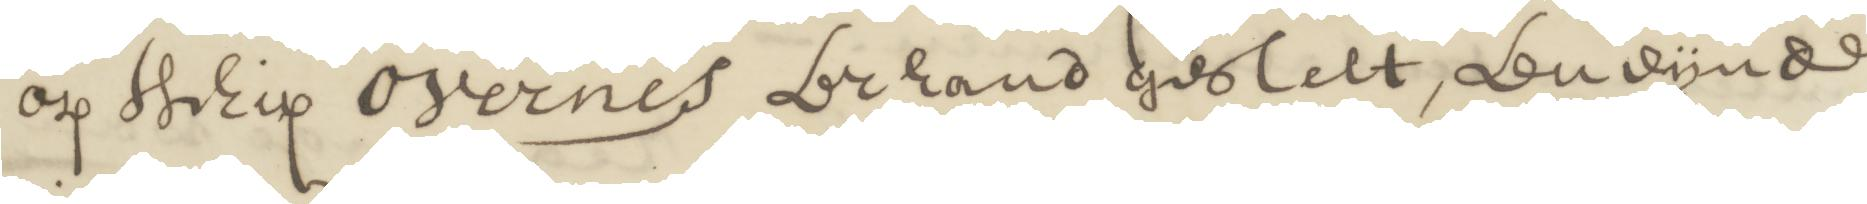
op tschip Overnes terhand gestelt, ten eijnde
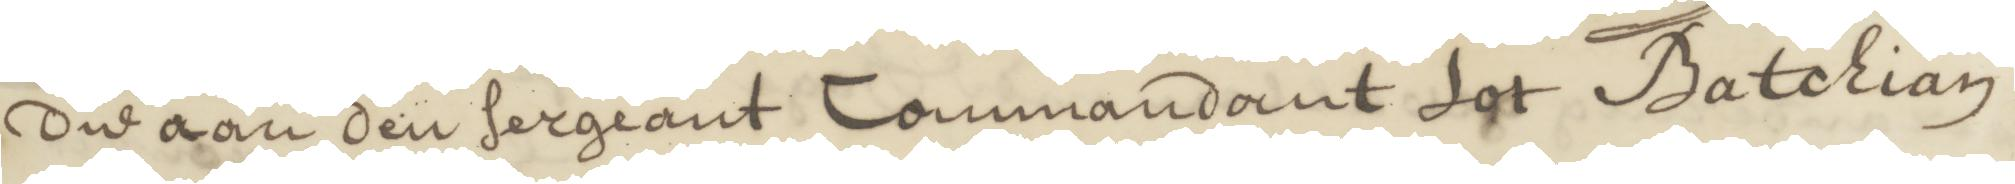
die aan den sergeant Commandant tot Batchian
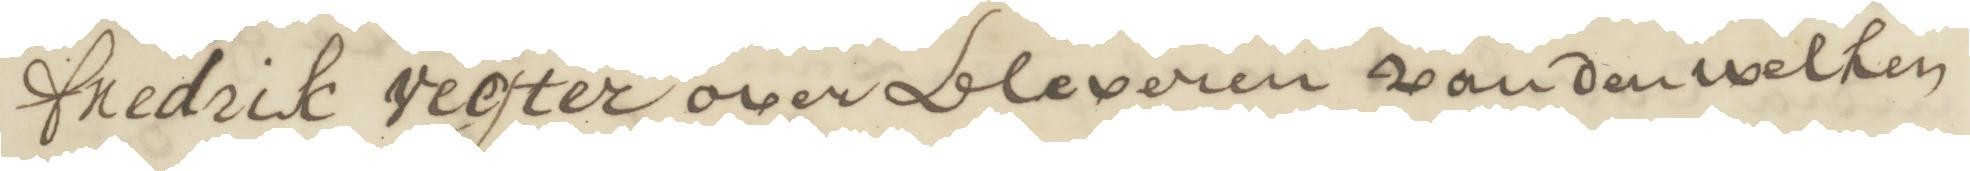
fredrik vegter over televeren van den welken
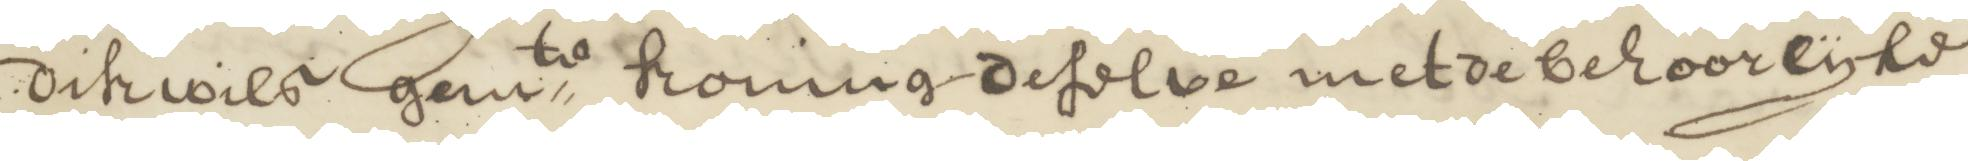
dikwils gem„te koning deselve met de behoorlijke
